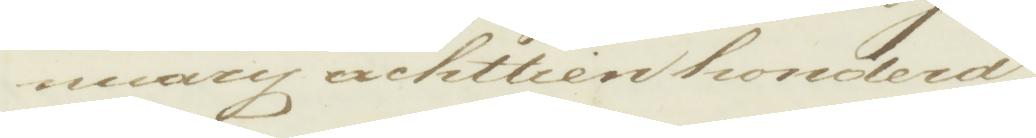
nuary achttien honderd
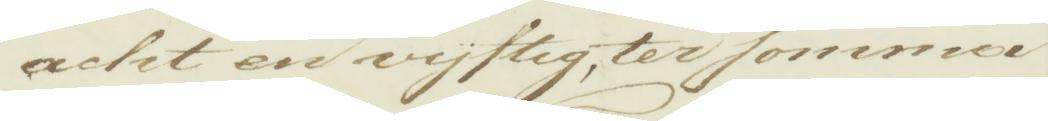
acht en vijftig, ter somma
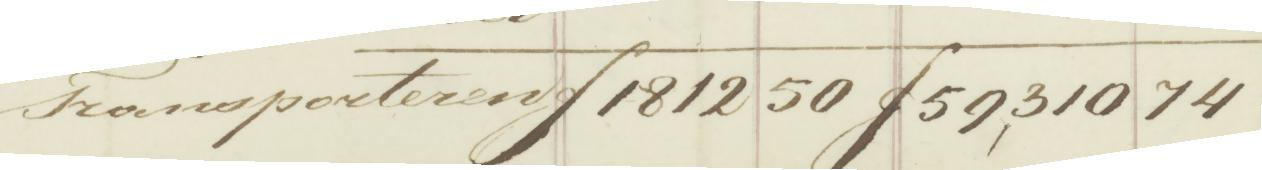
Transporteren ƒ 1812 50 ƒ59,310 74
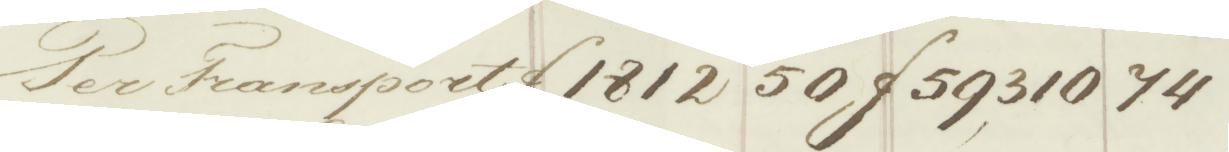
Per Transport ƒ 1812 50, ƒ59,310 74
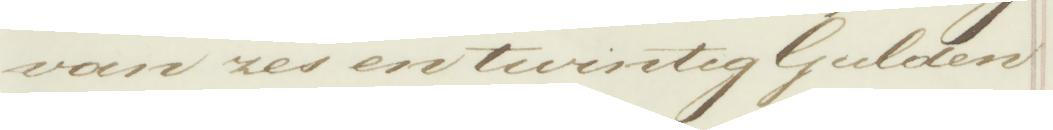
van zes en twintig Gulden
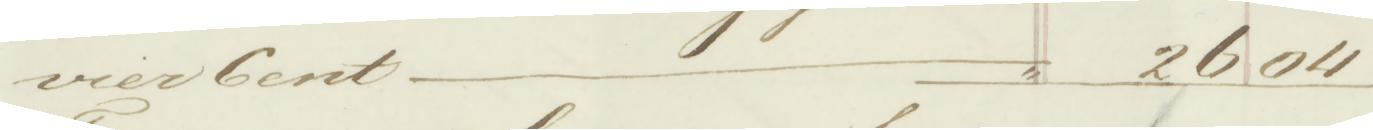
vier Cent —„ 26 04
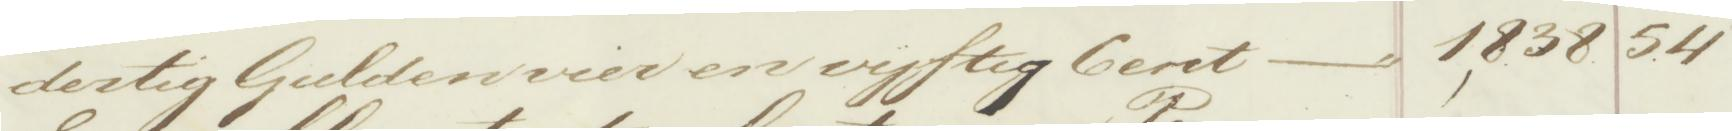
dertig Gulden vier en vijftig Cent —„ 1,838 5.4
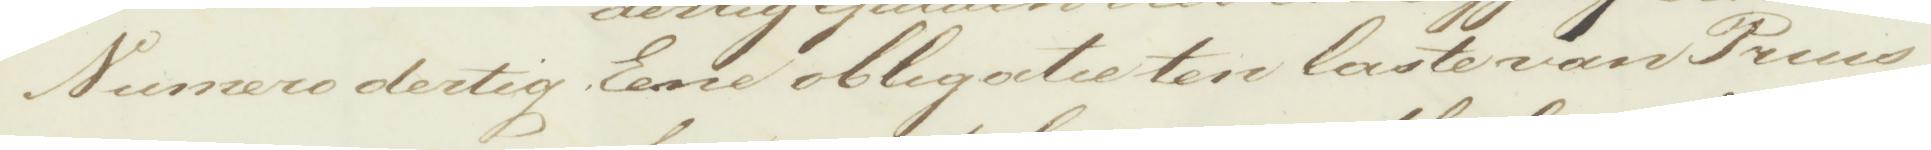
Numero dertig Eene obligatie ten laste van Pruis
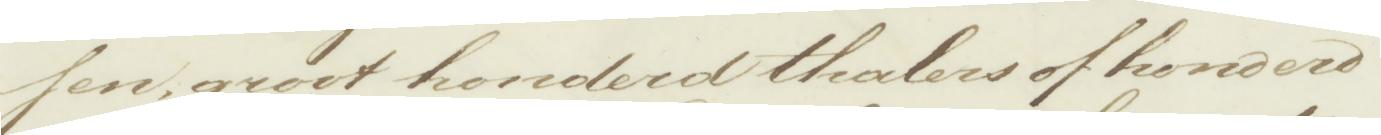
sen, groot honderd thalers of honderd
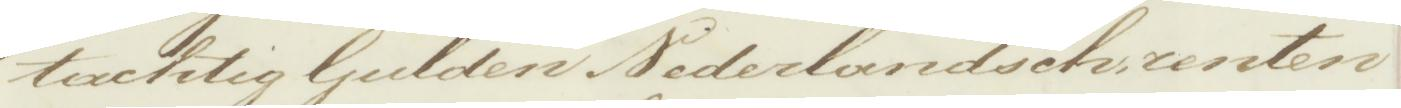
tachtig Gulden Nederlandsch, renten
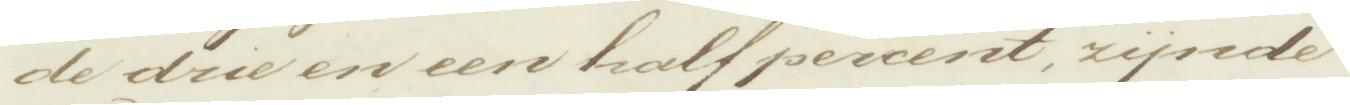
de drie en een half percent, zijnde
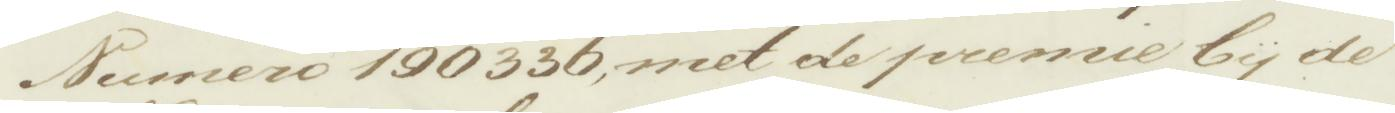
Numero 190336, met de premie bij de
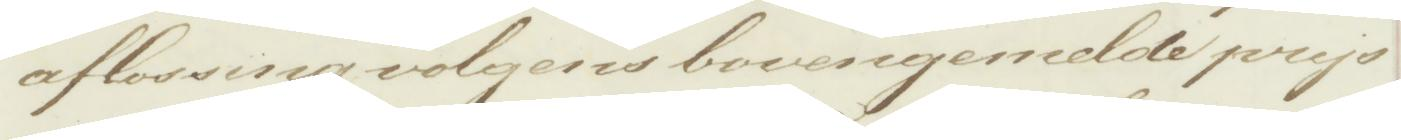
aflossing, volgens bovengemelde prijs
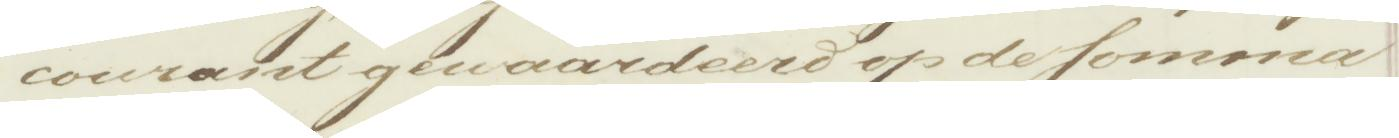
courant gewaardeerd op de somma
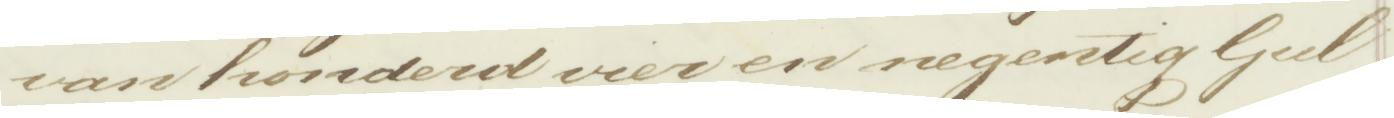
van honderd vier en negentig Gul
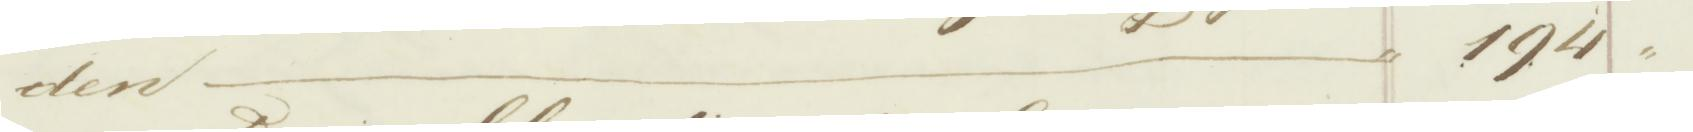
den —„194 „
